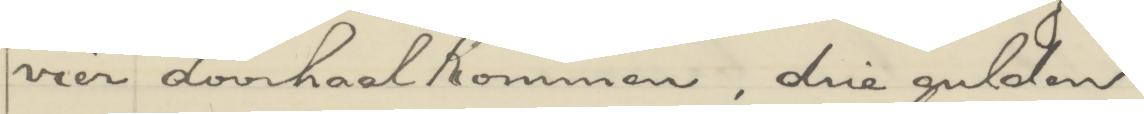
vier doorhaal kommen, drie gulden.
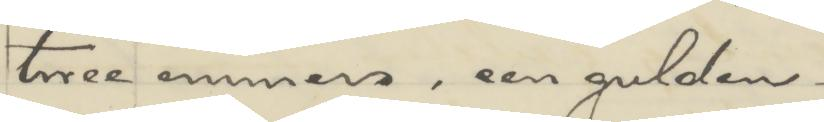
twee emmers, een gulden
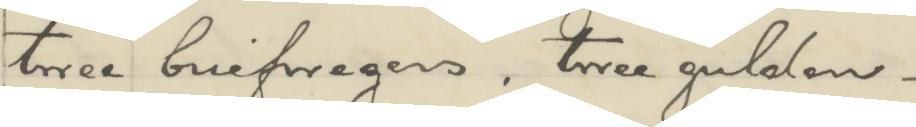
twee briefwegers, twee gulden
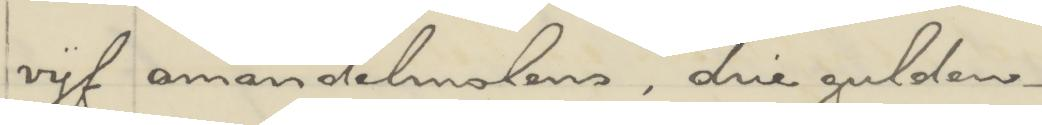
vijf amandelmolens, drie guldens
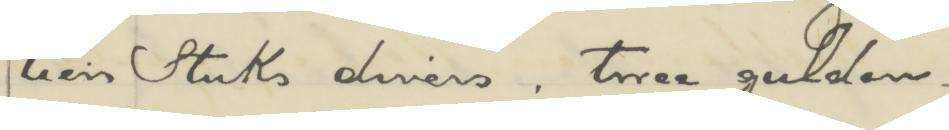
tien stuks divers, twee gulden.
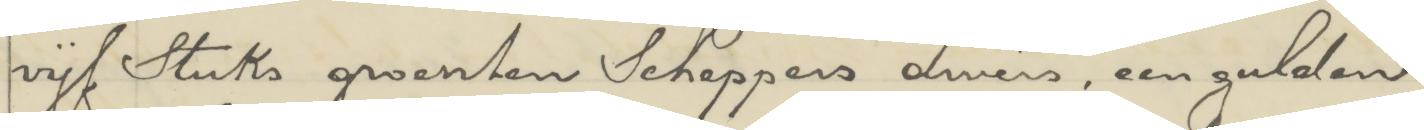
vijf stuks groenten scheppers divers, een gulden
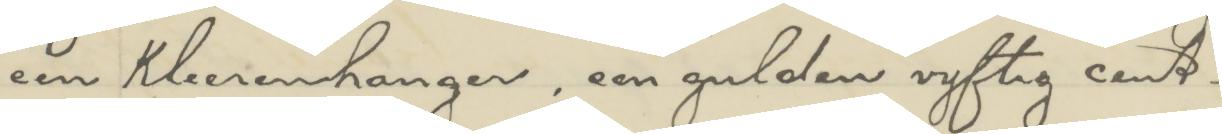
een kleerenhanger, een gulden vyftig cent
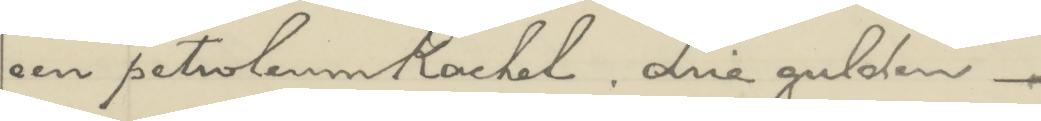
een petroleumkachel, drie gulden —
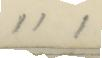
11 1
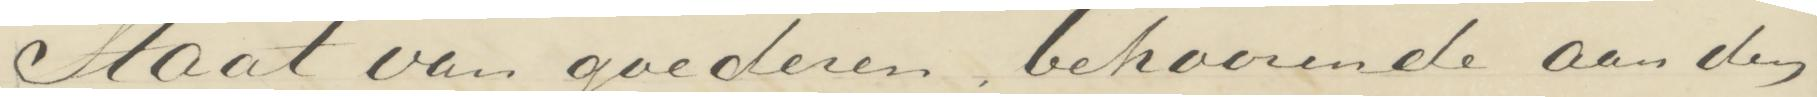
Staat van goederen, behoorende aan den
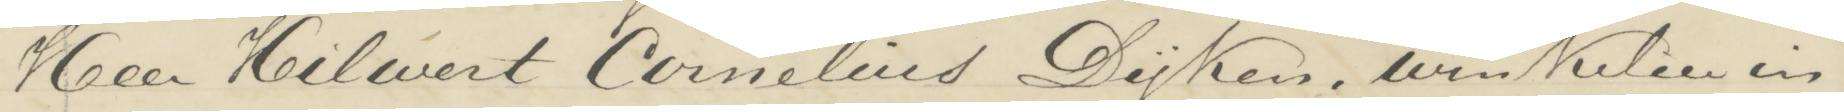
Heer Hilwert Cornelius Dijken, winkelier in
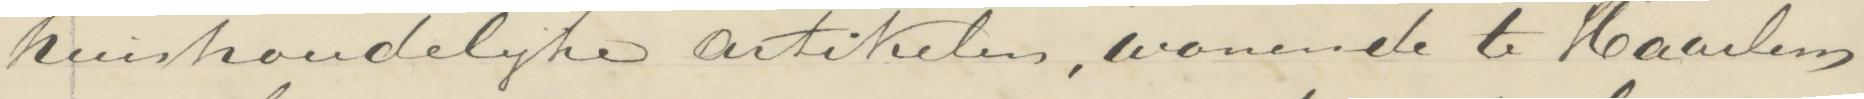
huishoudelyke artikelen, wonende te Haarlem
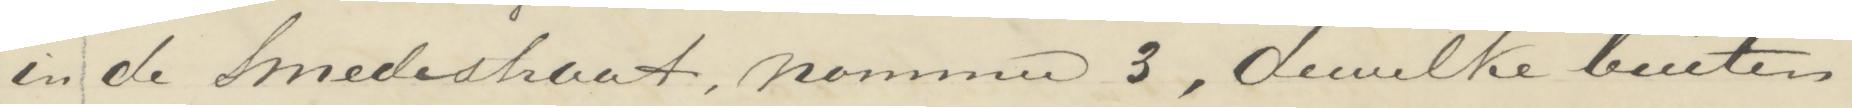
in de Smedestraat, nommer 3, dewelke buiten
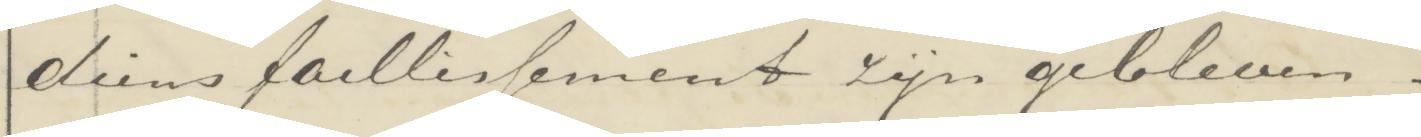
diens faillissement zijn gebleven
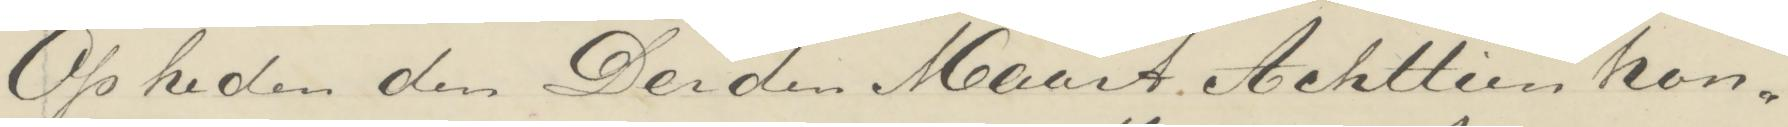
Op heden den Derden Maart Achttien hon„
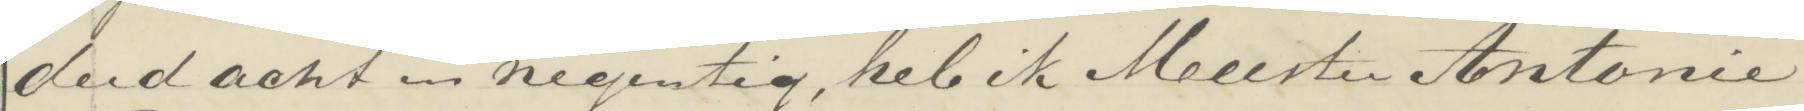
derd acht en negentig, heb ik Meester Antonie
